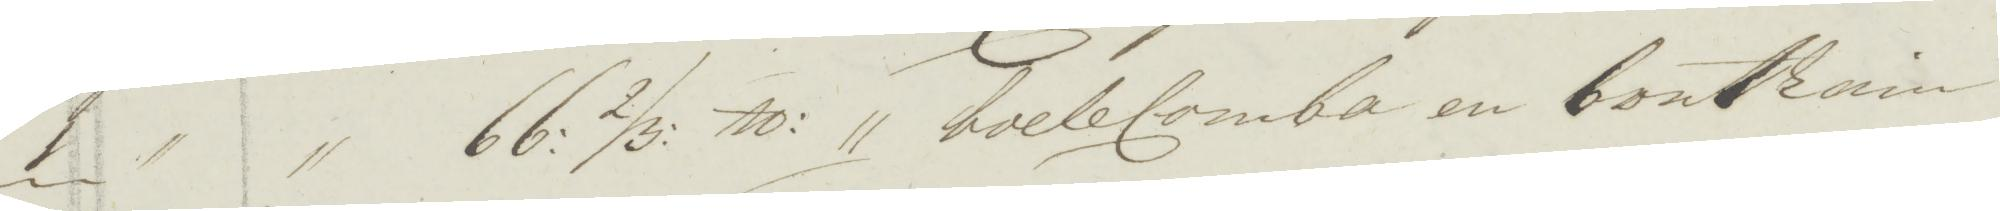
„ 66: 2/3: lb: „ boelecomba en borthain
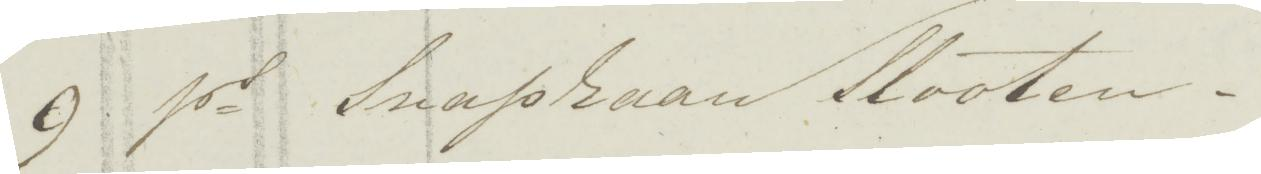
9 p=s snaphaan slooten -
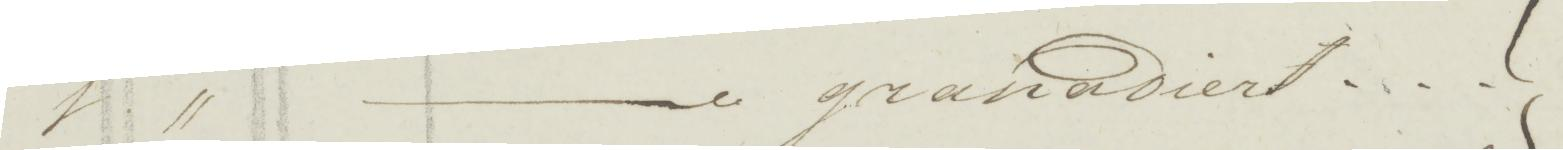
1 „ _o granadier
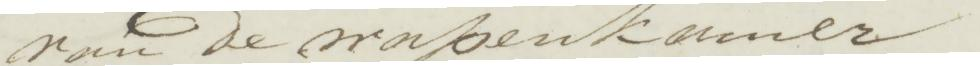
van de wapenkamer
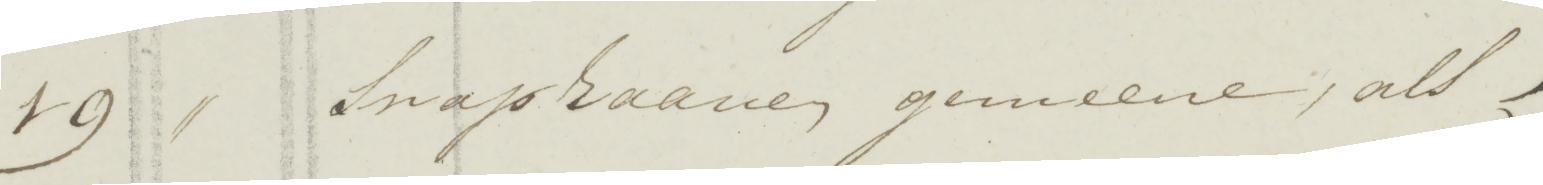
19 „ snaphaanen gemeene, als
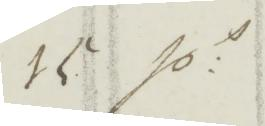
15 p:s
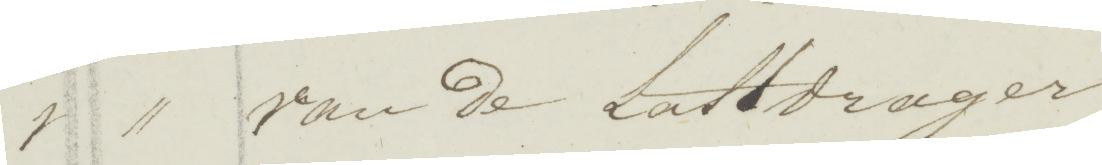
1 „ van de Lastdrager
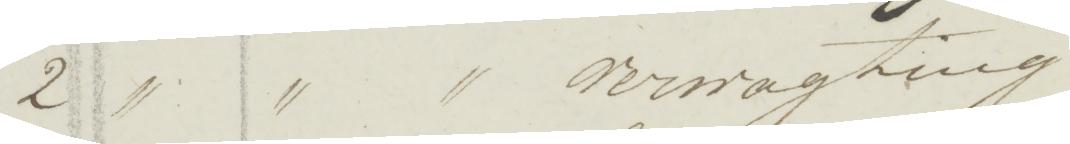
2 „ „ „ verwagting
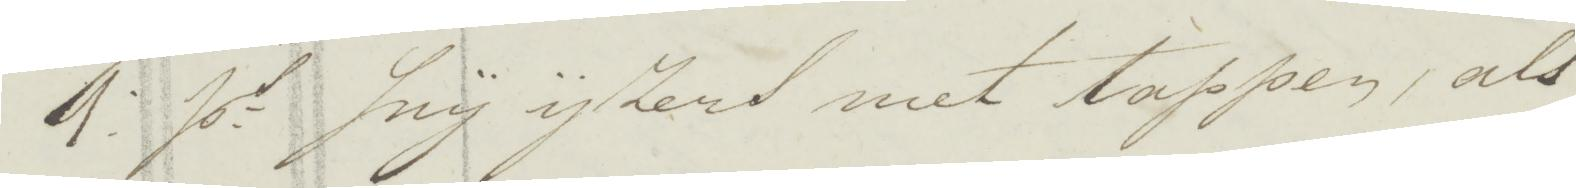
4: p=s snij ijzers met tappen, als
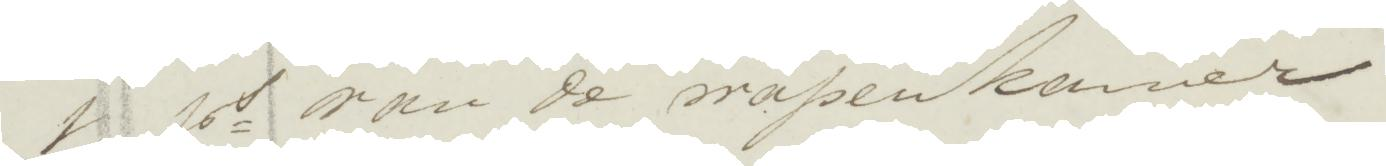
1 p=s van de wapenkamer
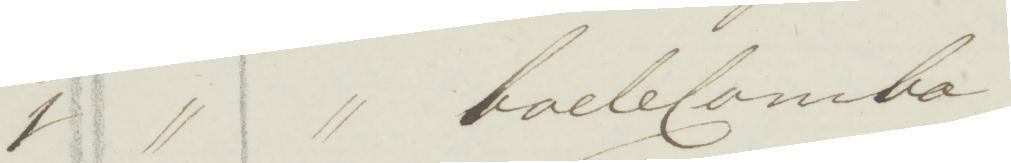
1 „ „ boelecomba
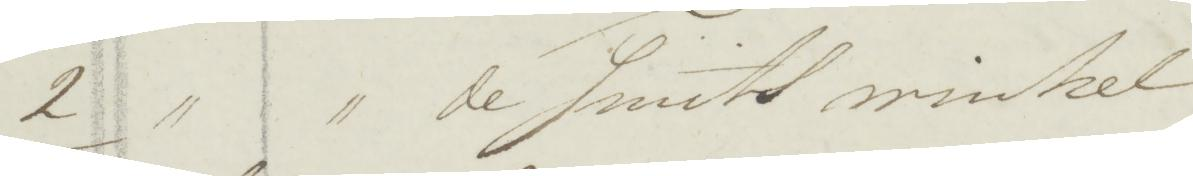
2 „ „ de smits winkel
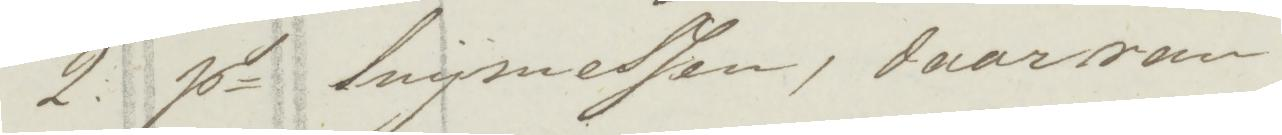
2: p=s snijmessen, daar van
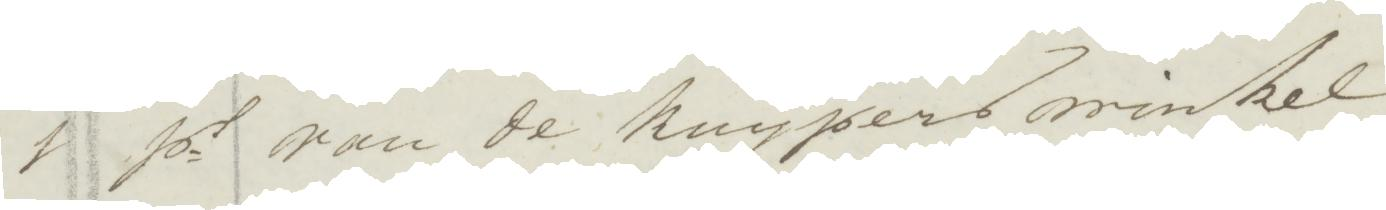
1 p=s van de kuijpers winkel
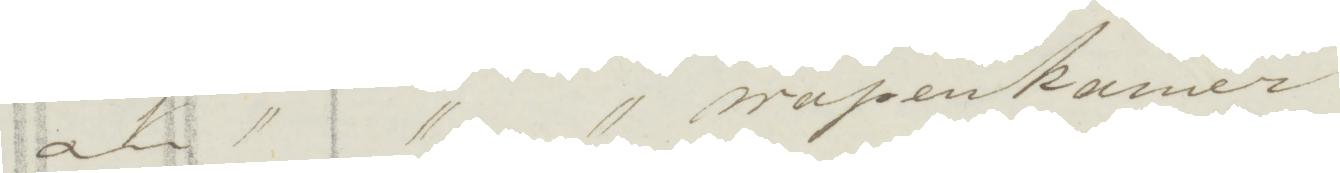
1 „ „ „ wapenkamer
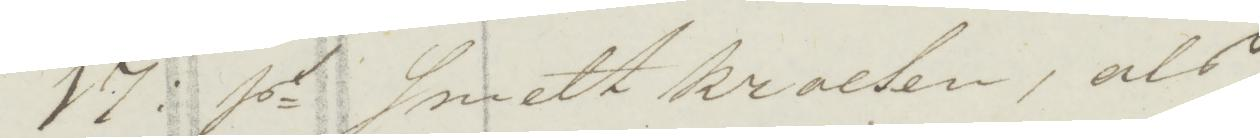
17: p=s smelt kroesen, als
